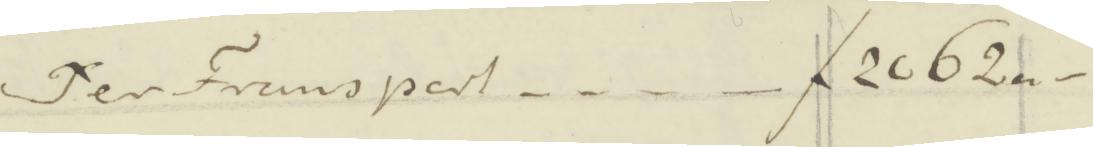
Per Transport - - - - ƒ2062„ –
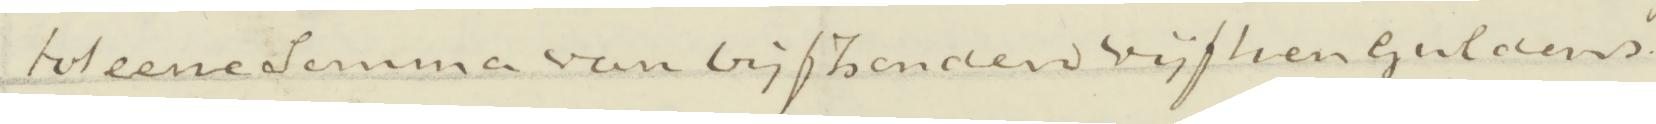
tot eene somma van vijf honderd vijftien guldens
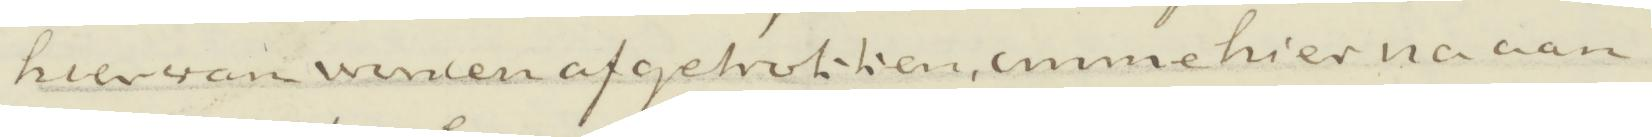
hier van worden afgetrokken, omme hier na aan
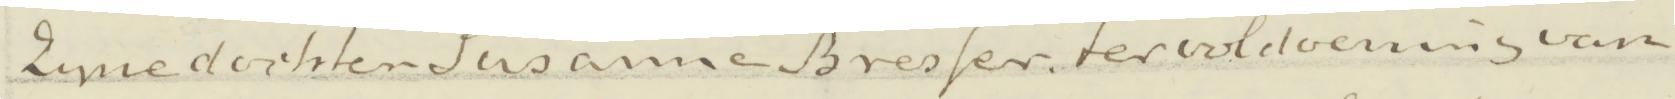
zyne dochter Susanne Bresser, ter voldoening van
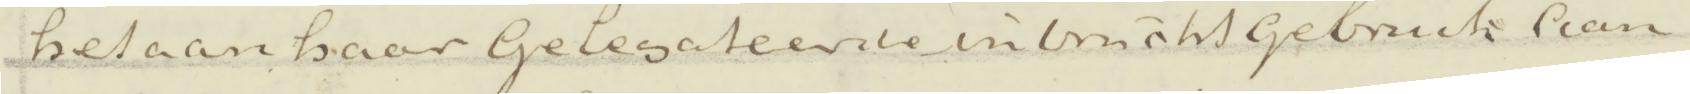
het aan haar Gelegateerde in vruchtgebruik Aan
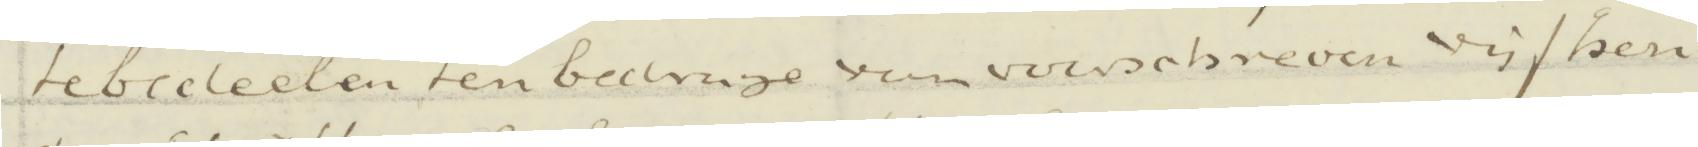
te bedeelen ten bedrage van voorschreven vijf hon
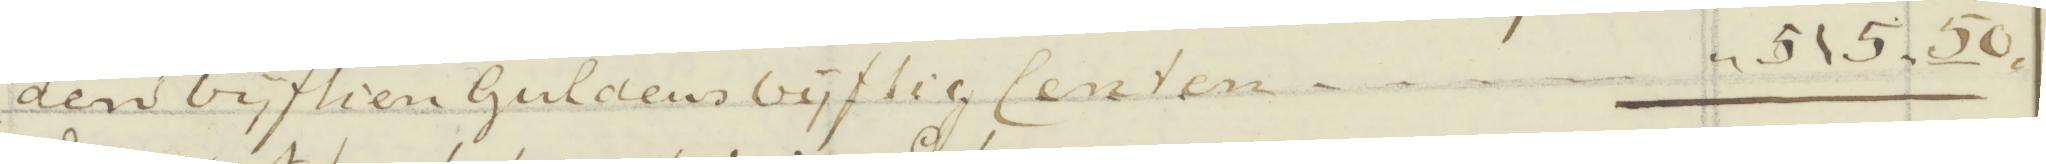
derd vijftien Guldens vijftig Centen - - - - - „ 515„50„
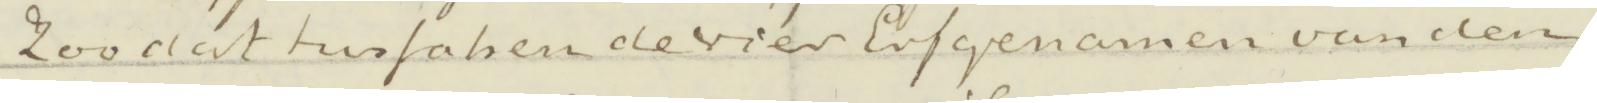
zoo dat tusschen de vier Erfgenamen van den
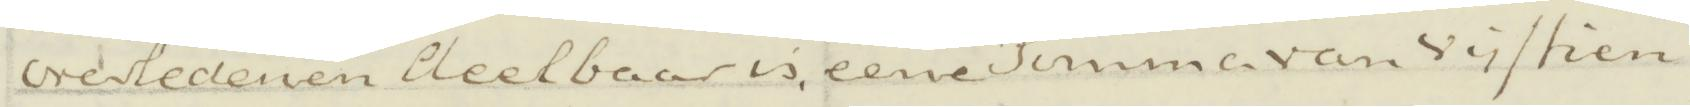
overledenen deelbaar is, eene somma van vijftien
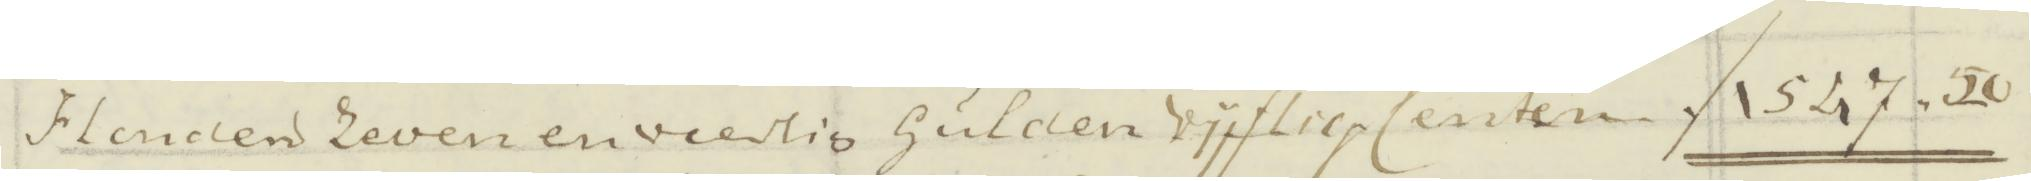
Honderd zeven en veertig Gulden vijftig Centen - ƒ1547„50
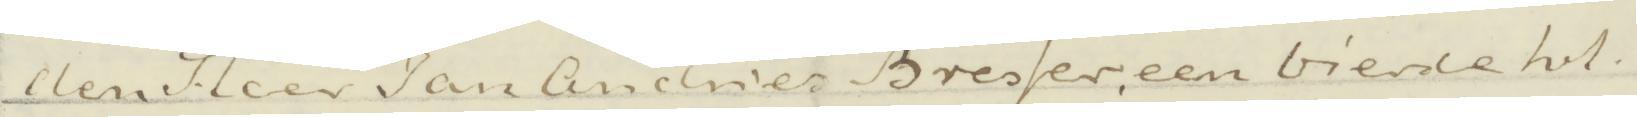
den Heer Ian Andries Bresser, een vierde tot
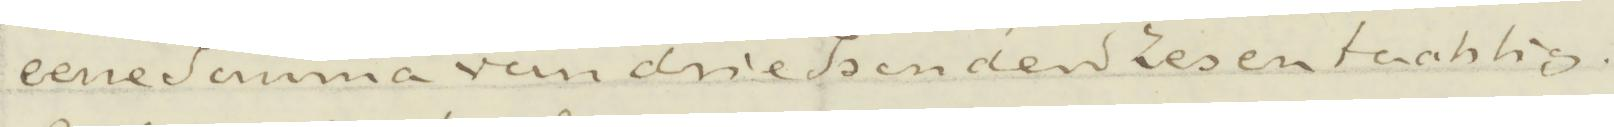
eene somma van drie honderd zes en tachtig
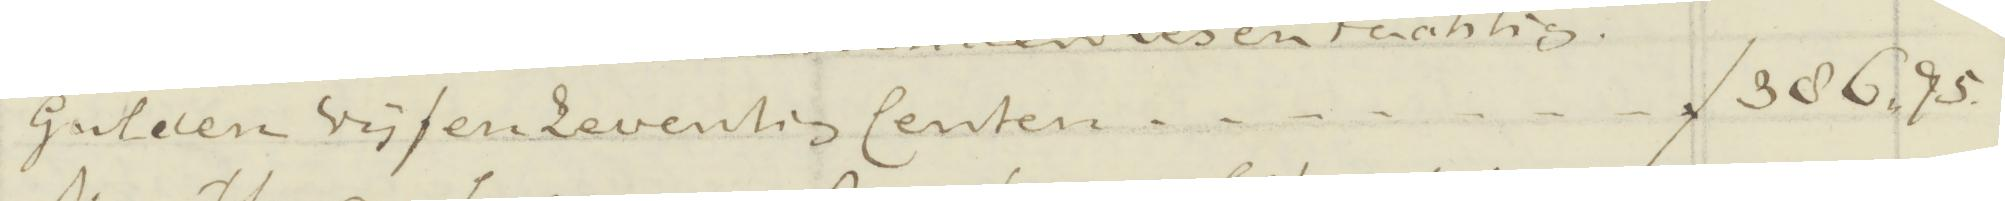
Gulden vijf en zeventig Centen - - - - - - - ƒ386„75.
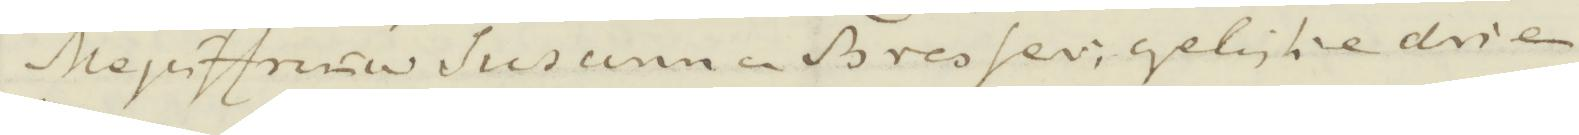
Mejuffrouw Susanna Bresser, gelijke drie
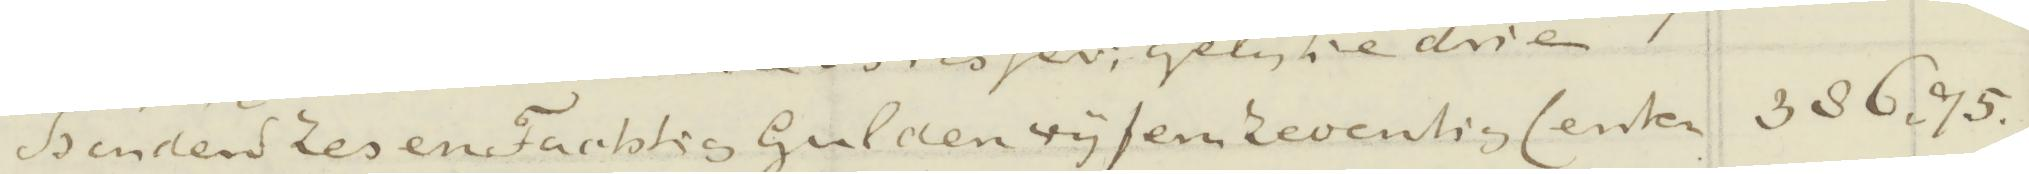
honderd zes en Tachtig Gulden vijf en zeventig Centen 386„75.
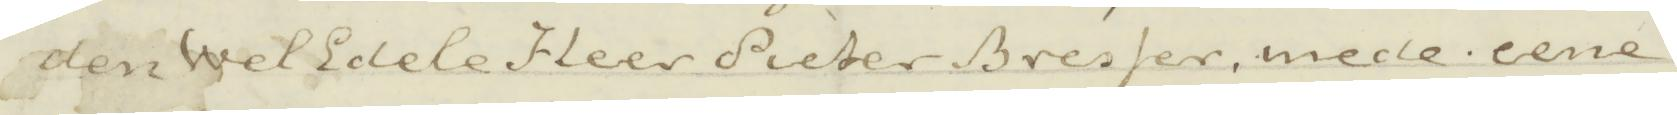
den wel Edele Heer Pieter Bresser, mede eene
